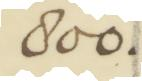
800.
